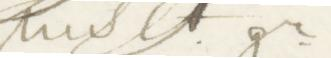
inver l.t g.r
